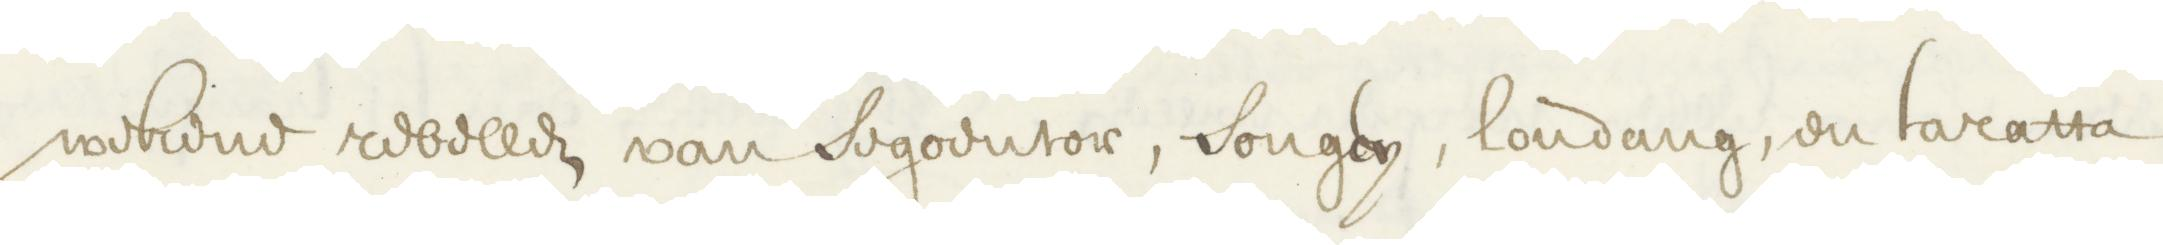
wekene rebellen van segoentor, songey, londang, en taratta
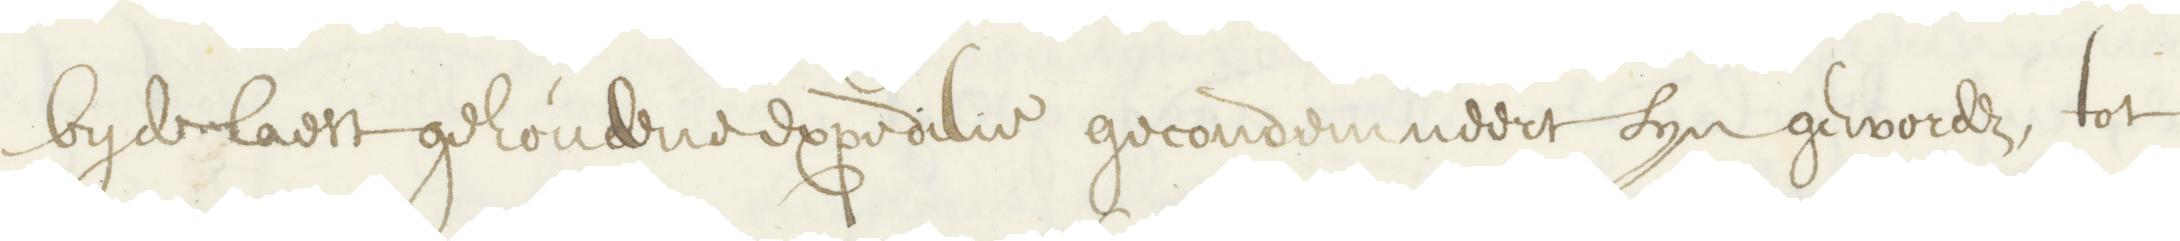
bijde laest gehoudene expeditie gecondemneert syn geworden, tot
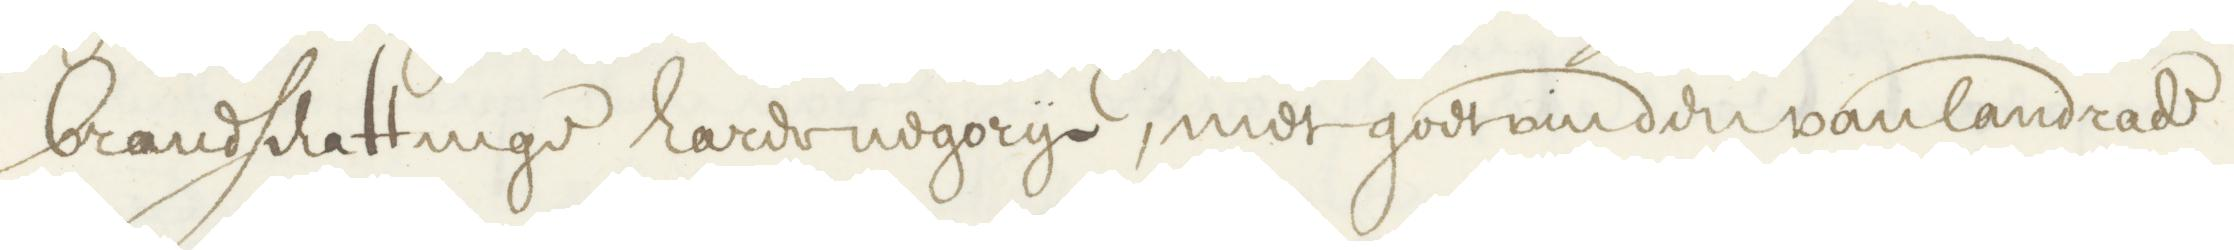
brandschattinge harer negorije, met goetvinden van landrade
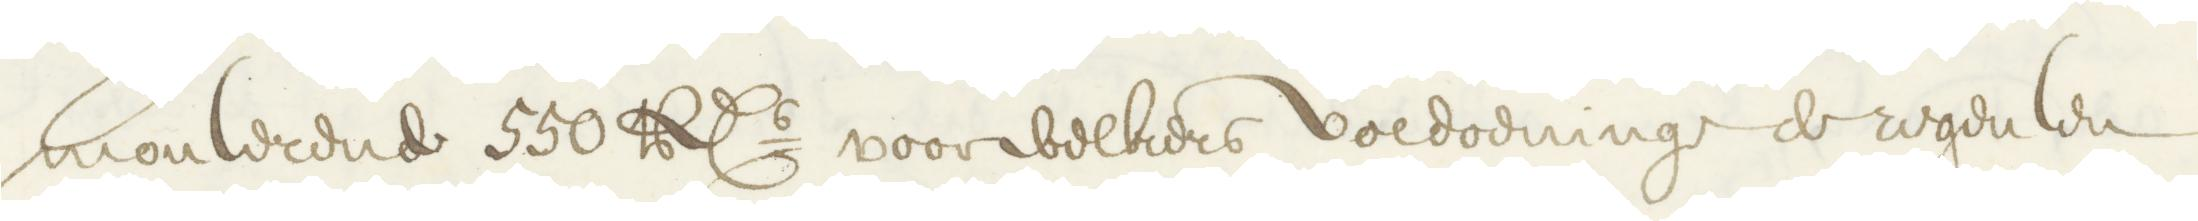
monterende 550 RX=s voorwelkers voldoeninge de regenten
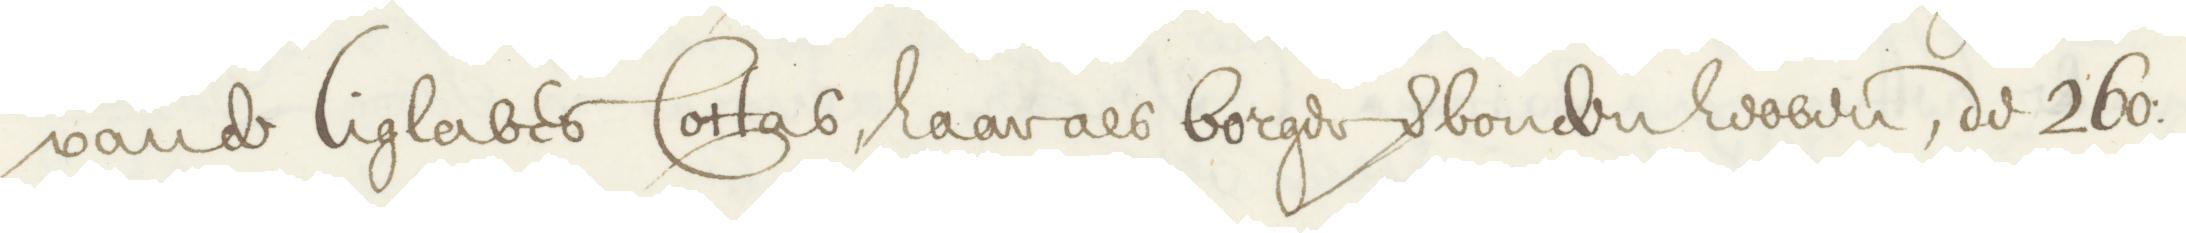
vande tiglabes Cottas, haar als borger verbonden hebben, de 260:
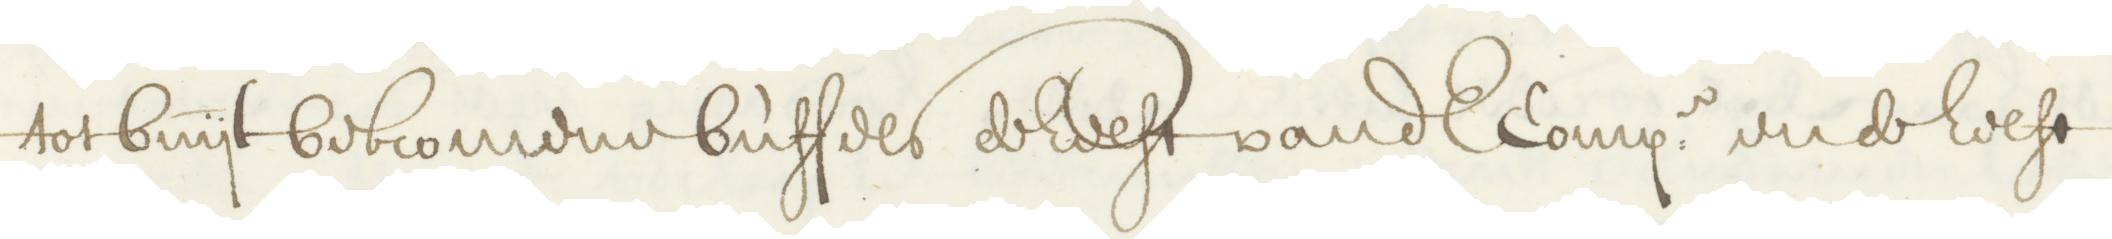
tot buijt bekomene buffels de helft van dEComp„e en de helft
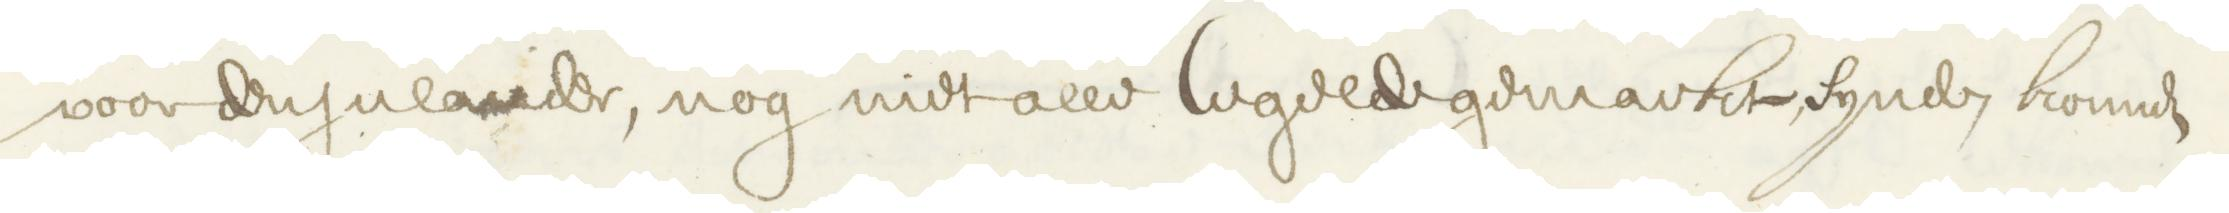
voor den jnlander, nog niet alle tegelde gemaekt, synden konnen
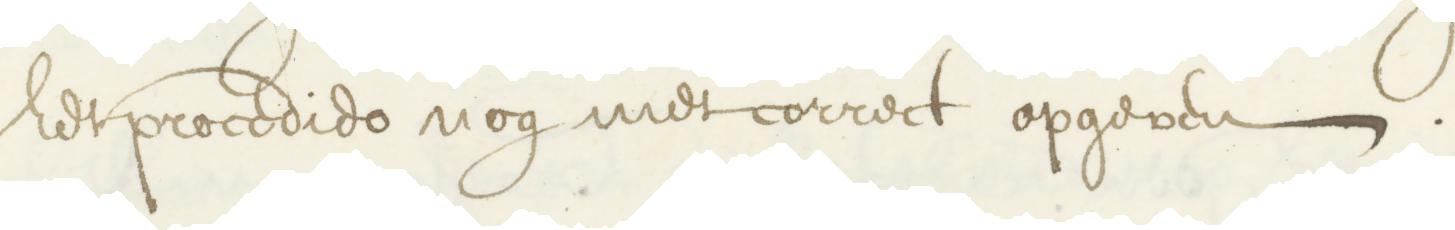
het procedido nog niet correct opgeven.
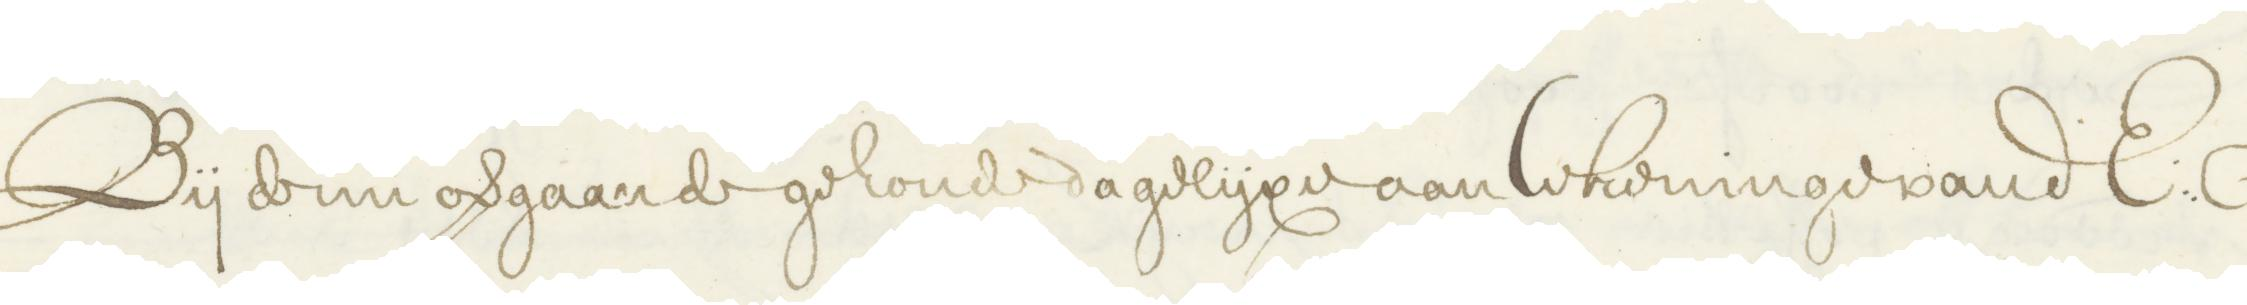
Bij de nu overgaande gehoude dagelijxe aan tekeninge van d’ E:
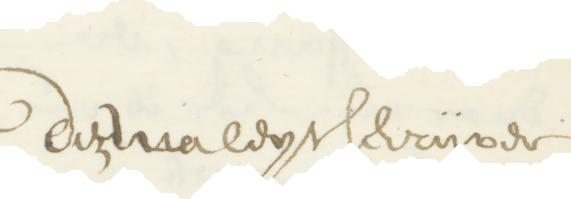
den Maleyt schrijver
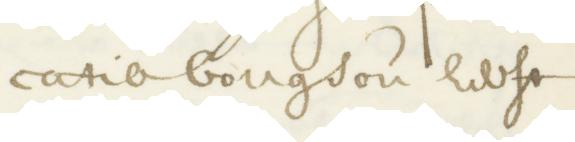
catib bongsou heeft
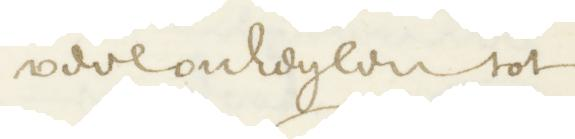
veel onheijlen tot
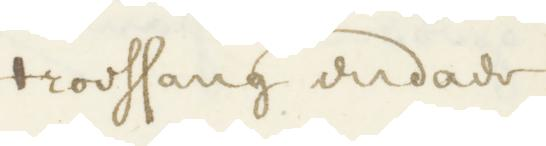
troessang en daer
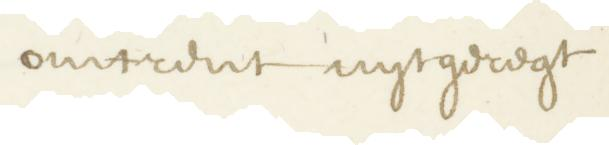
omtrent uytgeregt
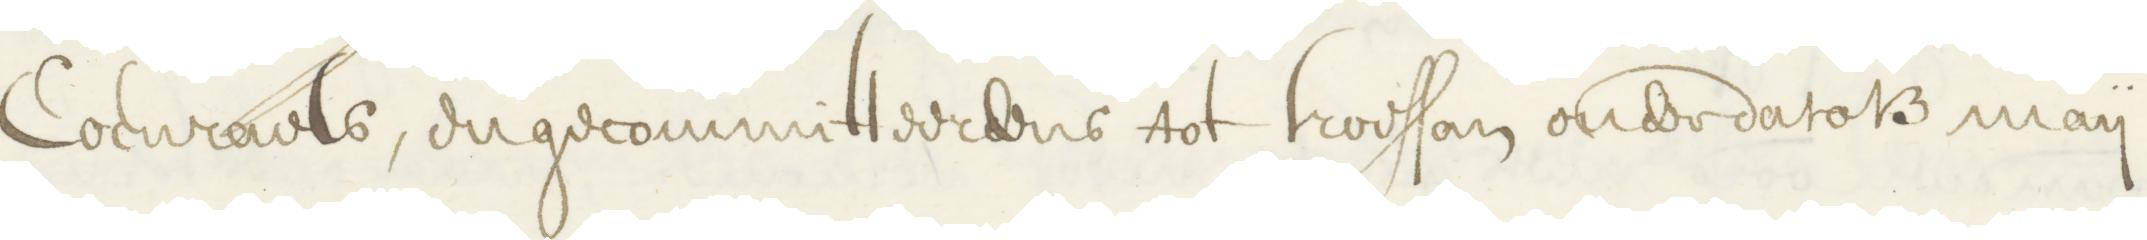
Coenraets, en gecommitteerdens tot troessan onder dato 13 maij
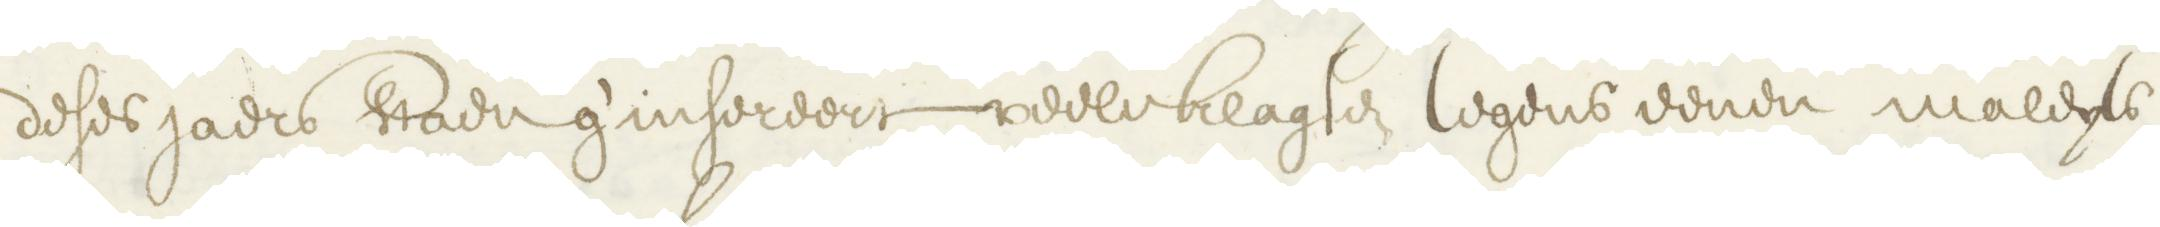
deses jaers staen g’insereert veele klagten tegens eenen maleyts
